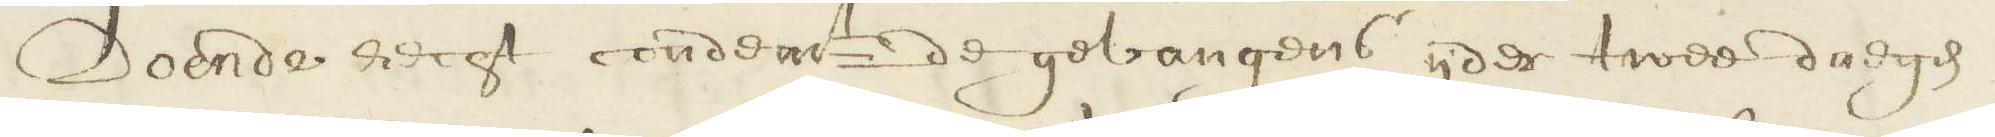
Doende reegt condem=t de gevangens ijder twee daegen
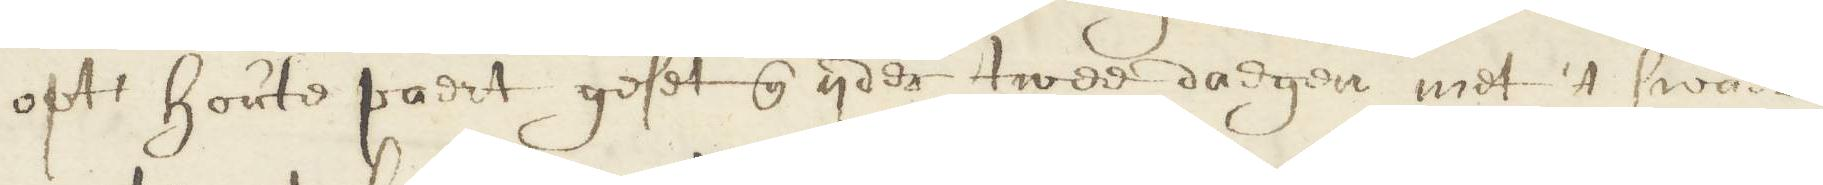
opt' houte paert geset ende ijder twee daegen met ’t swaer
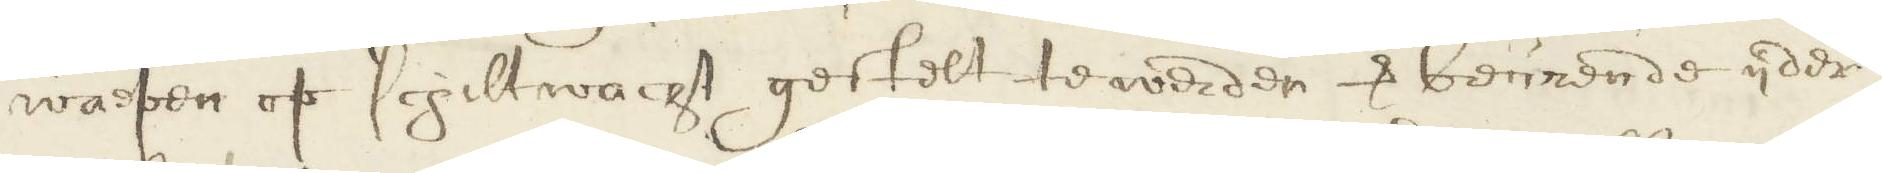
waepen op schiltwacht gestelt te werden verbeurende ijder
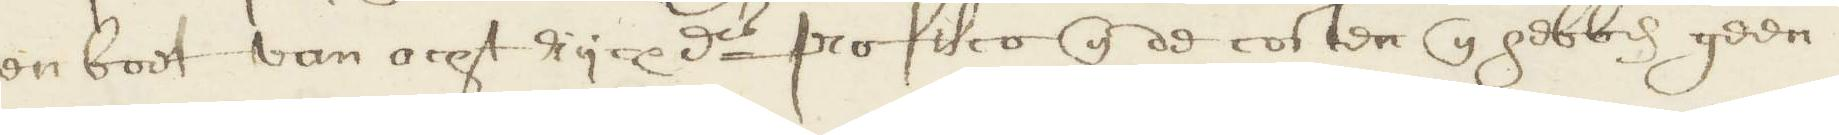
en boet van acht rijcxd=rs profisc ende de costen ende hebben geen
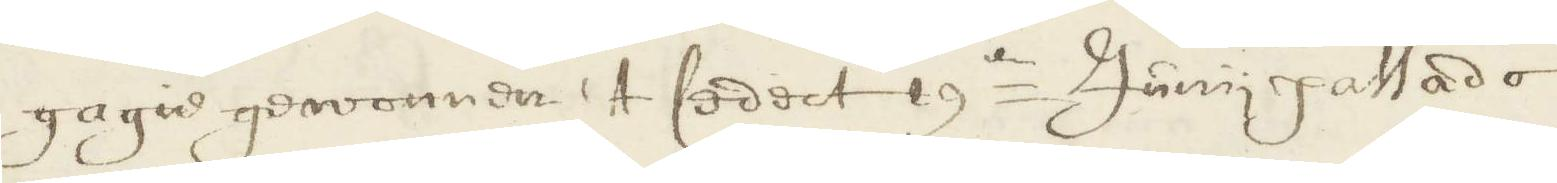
gagie gewonnen 't sedert 19=en Junij passado
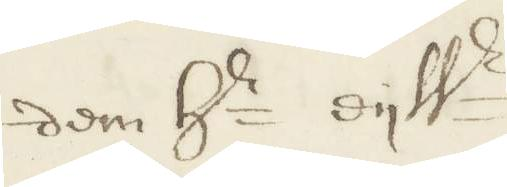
Jdem h=r eijss=r
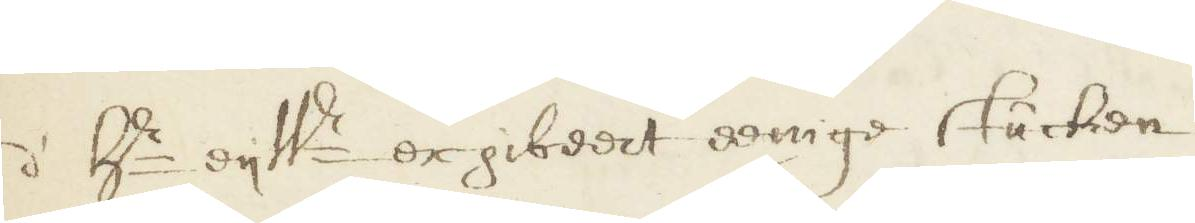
d’ H=r eijss=r exhibeert eenige stucken
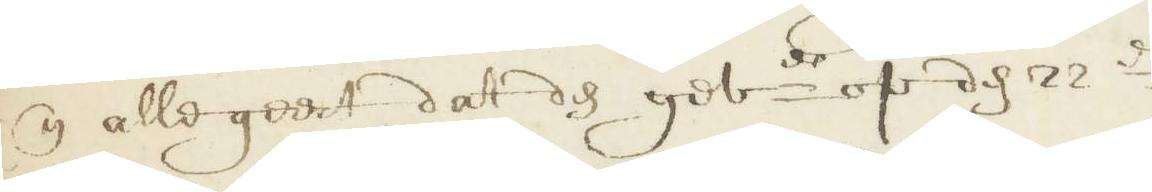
ende allegeert dat den gev=es op den 22=en
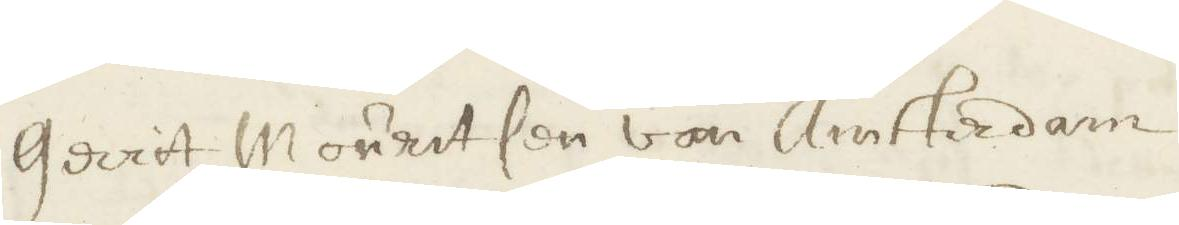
Gerrit Mauritsen van Amsterdam
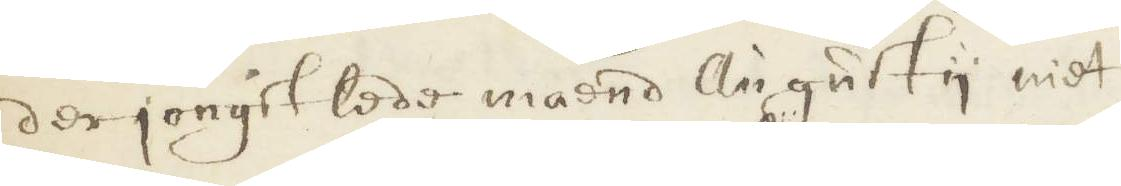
der jongstlede maend Augustij niet
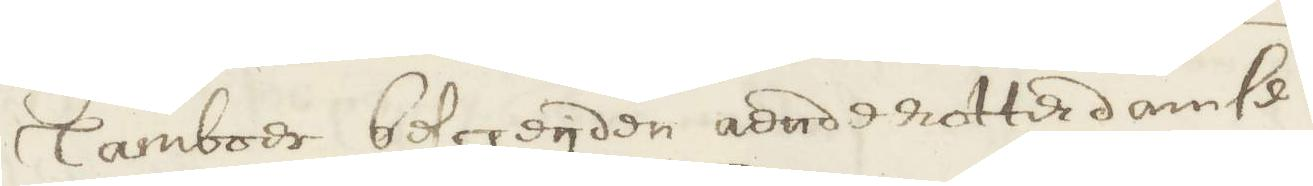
Tamboer bescheijden aende rotterdamse
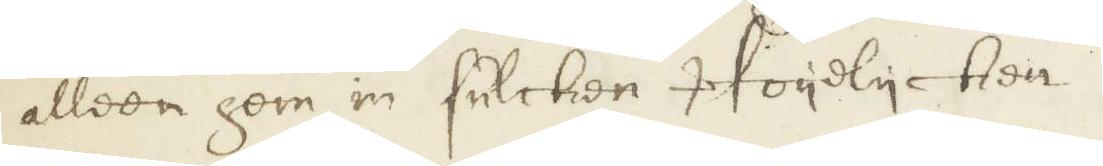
alleen hem in sulcken verfoijelijcken
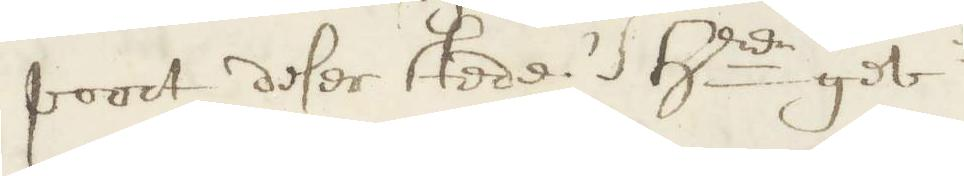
poort deser stede 's H=ren gev=e
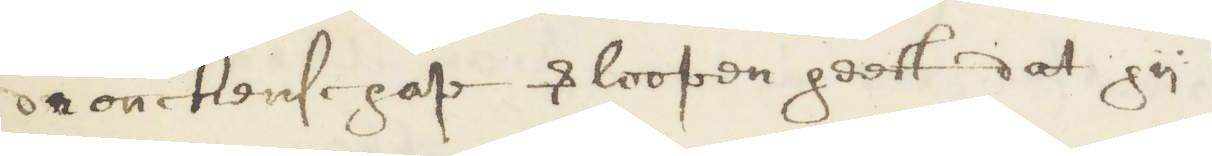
dronckenschap verloopen heeft dat hij
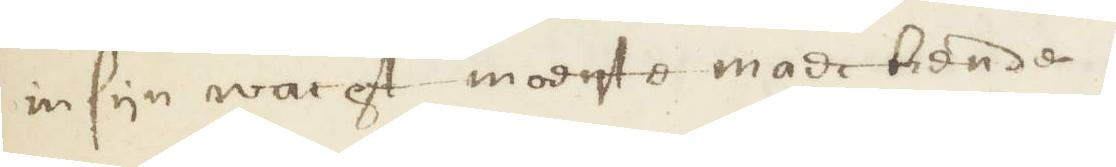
in sijn wacht moeyte maeckende
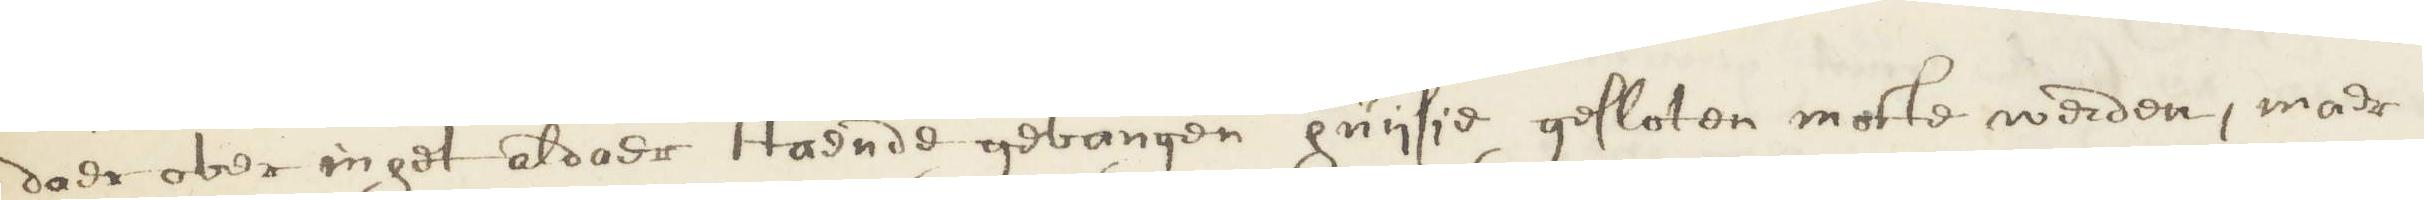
daer over in het aldaer staende gevangen huijsie gesloten moste werden, maer
